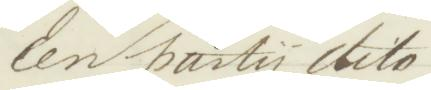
Een partij dito
